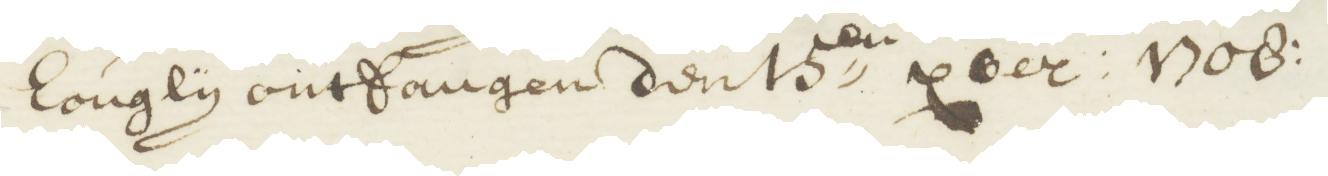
houglij ontfangen den 15„en xber: 1708:
